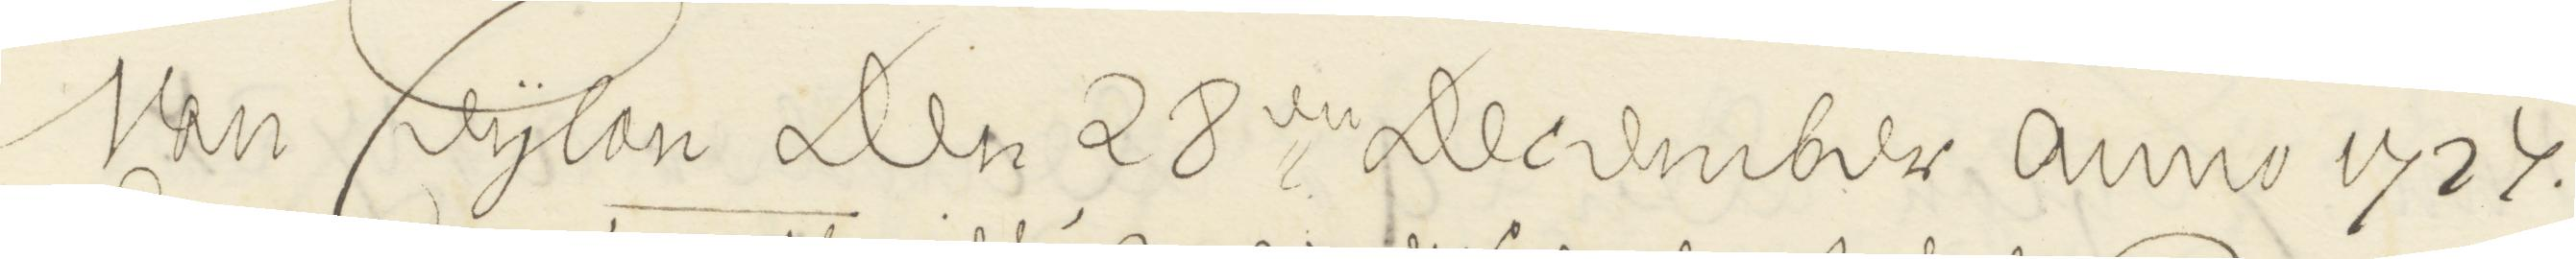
Van Ceijlon Den 28„en December Anno 1727.
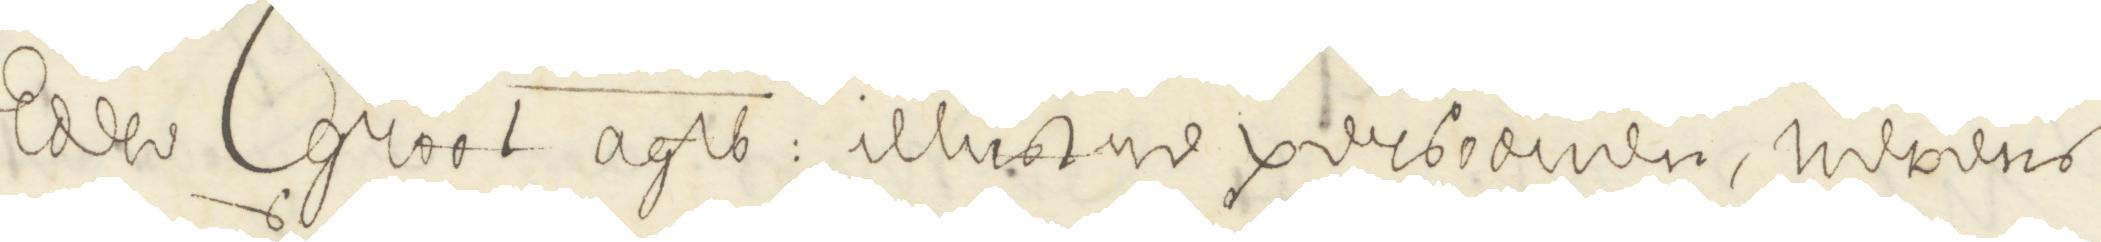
Edele groot agtb: illustre persoonen, nevens
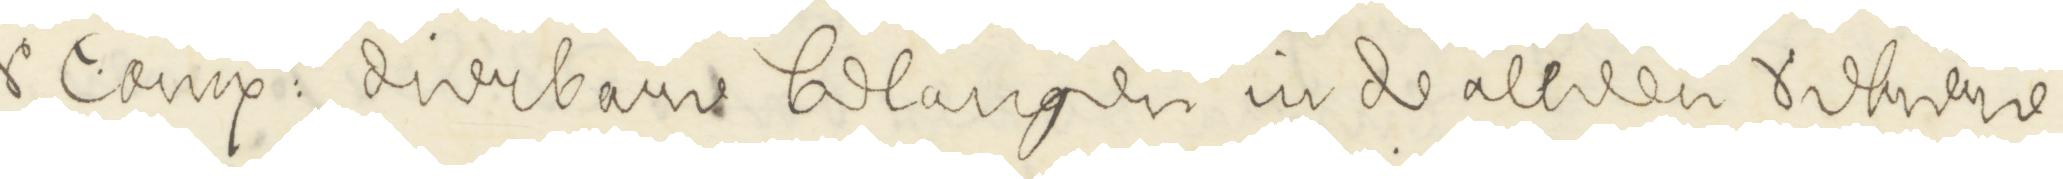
's Comp:s dierbare belangen in de alleen sekere
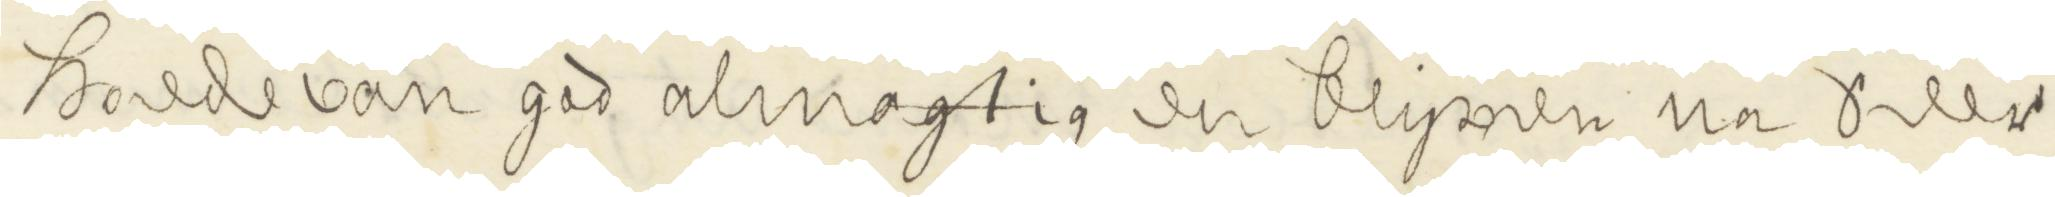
hoede van god almagtig en blijven na seer
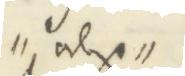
„alg„
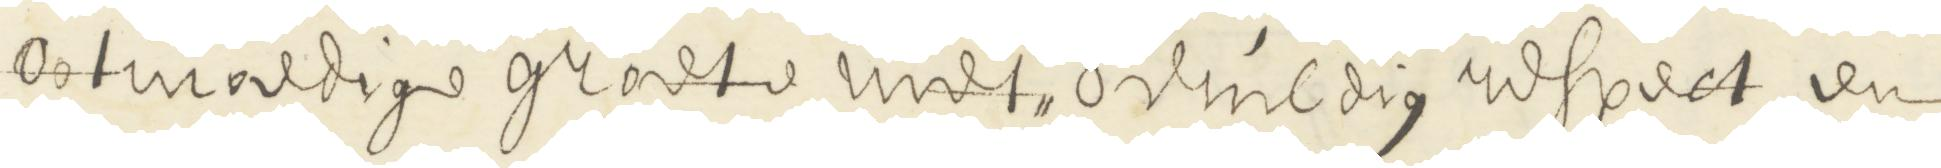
ootmoedige groete met „ eduldig respect en
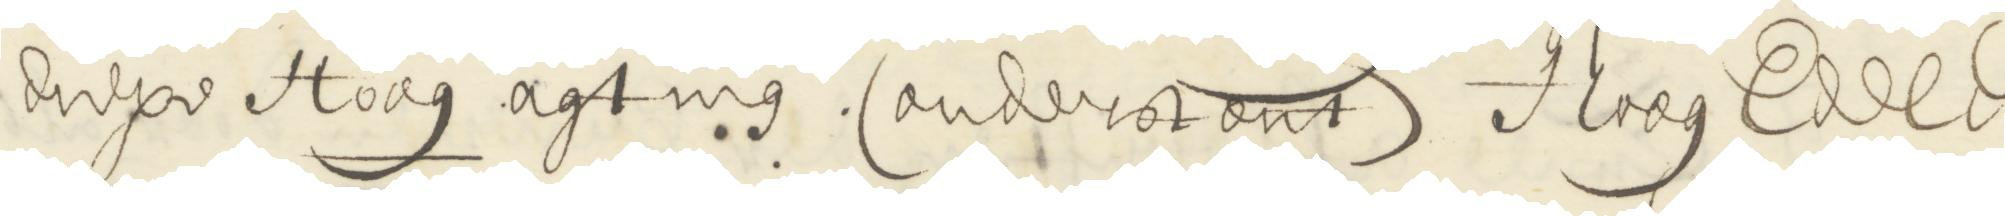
diepe Hoog agting. (onderstont) Hoog Edele
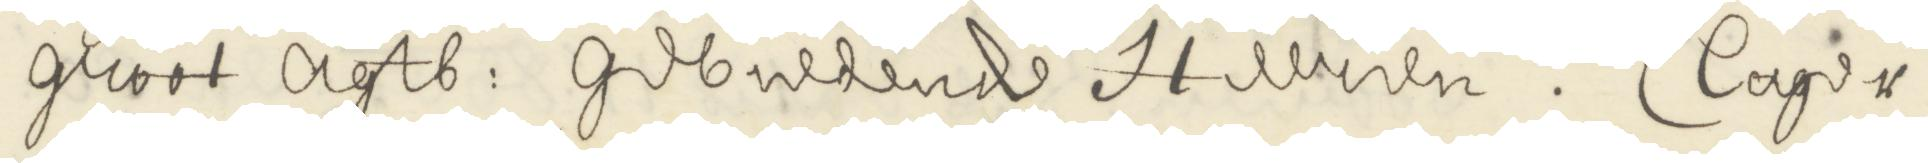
groot Agtb: gebiedende Heeren. (lager)
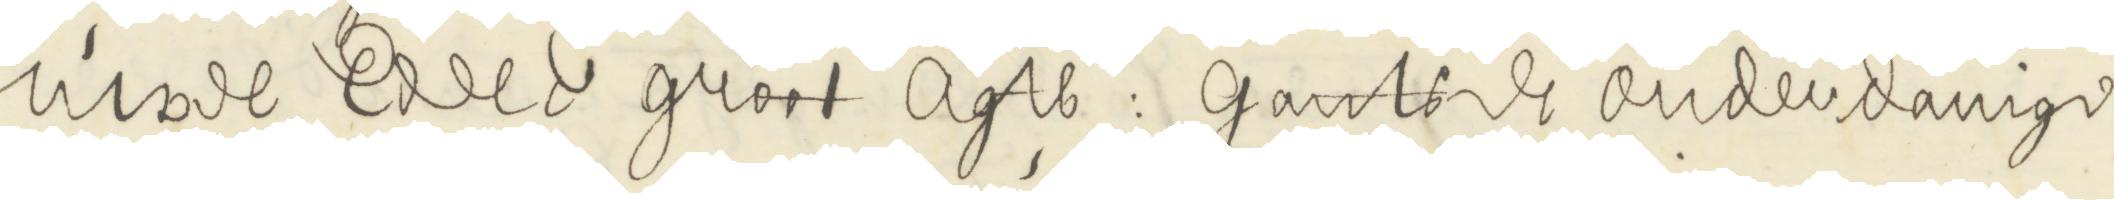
uwel Edele groot Agtb: gantse onderdanige
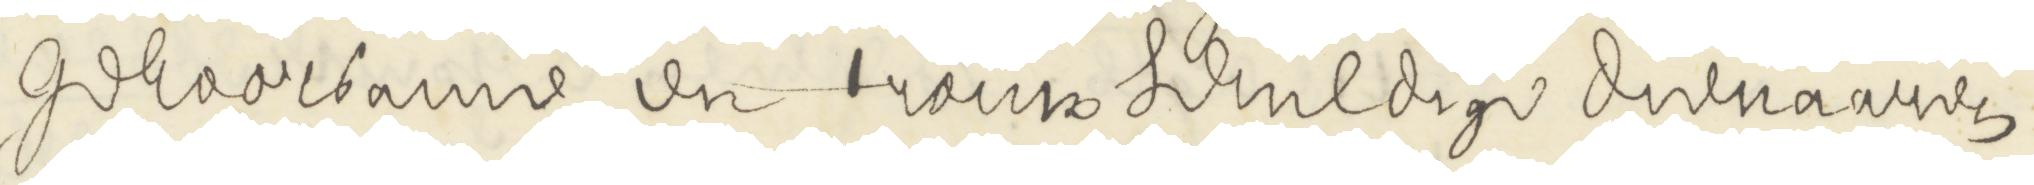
gehoorsame en trouw schuldige dienaaren
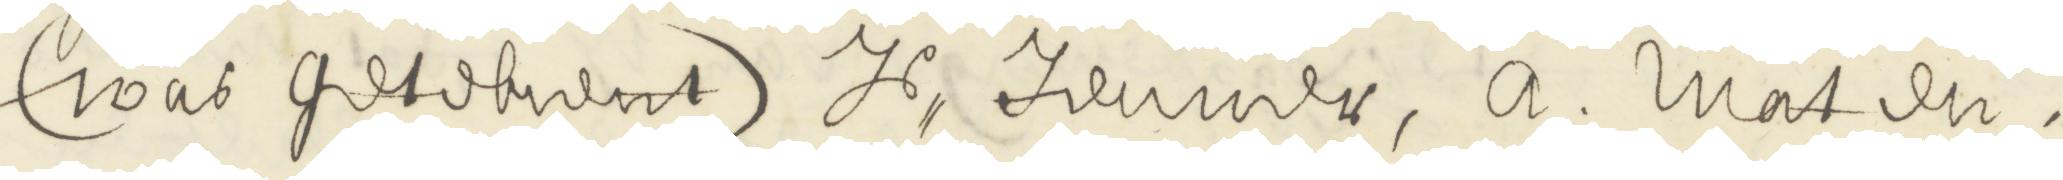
(was getekent) I„s Ienner, A. Maten,
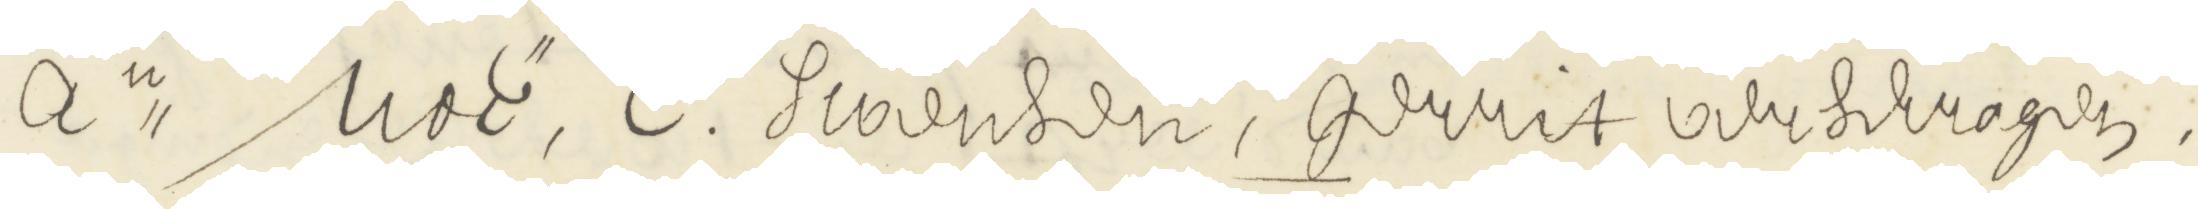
A„n noë, E. swensen, gerrit verschragen,
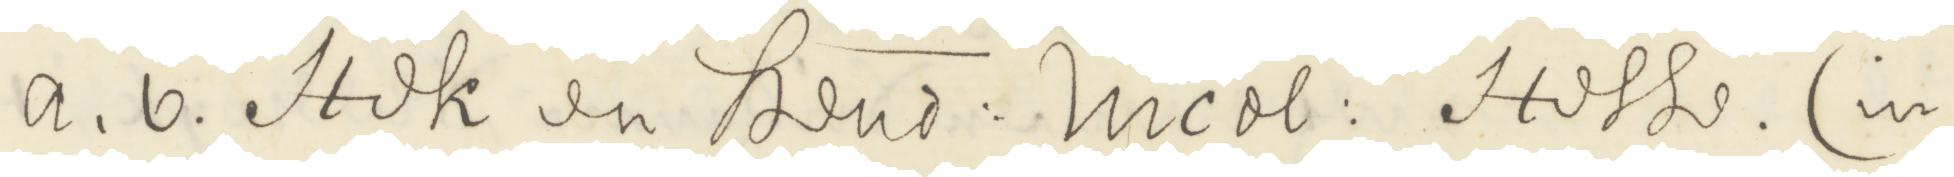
a. v. Hek en Hend: Nicol: Hesse. (in
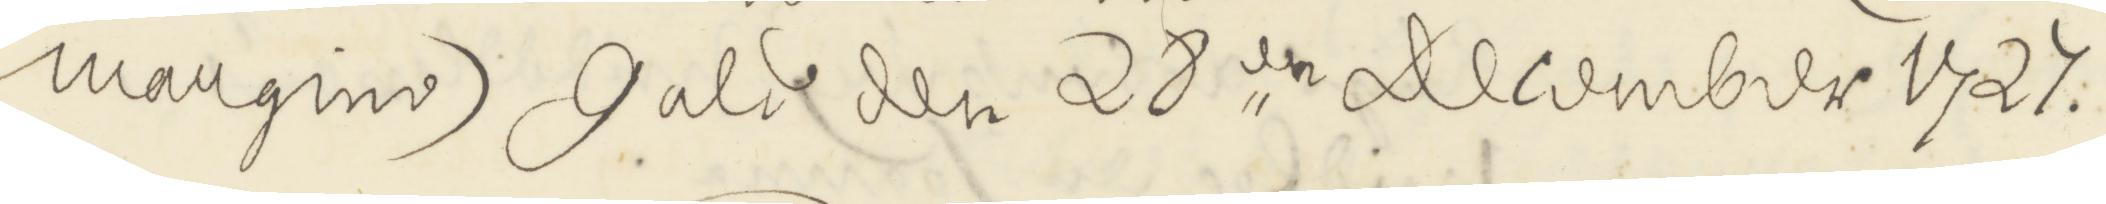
margine) Gale den 28„en December 1727.
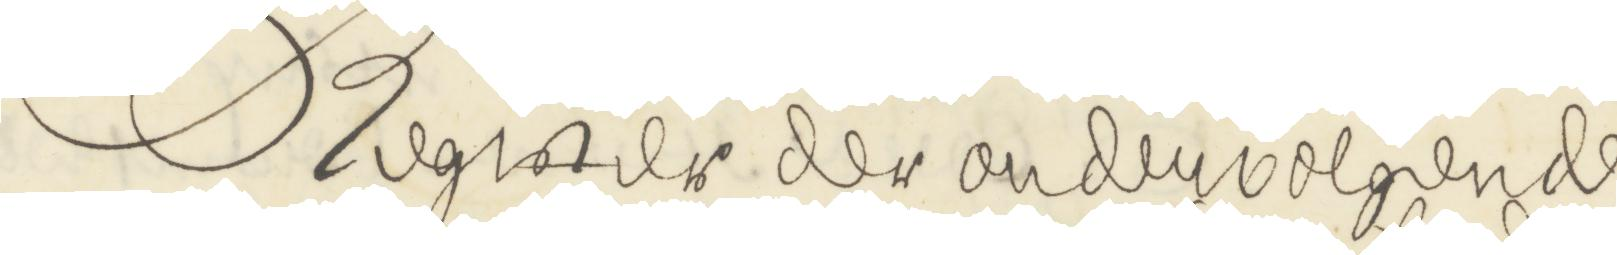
Register der ondervolgende
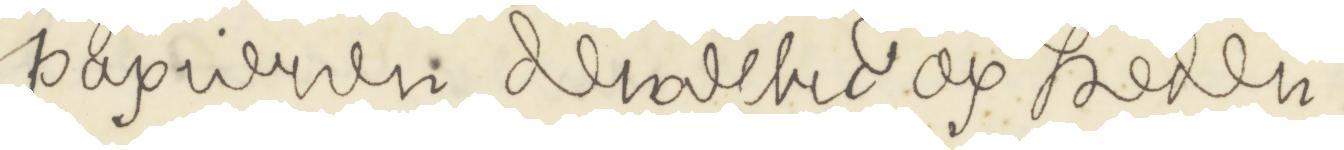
papieren dewelke op heden
